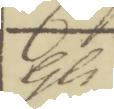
Gls
